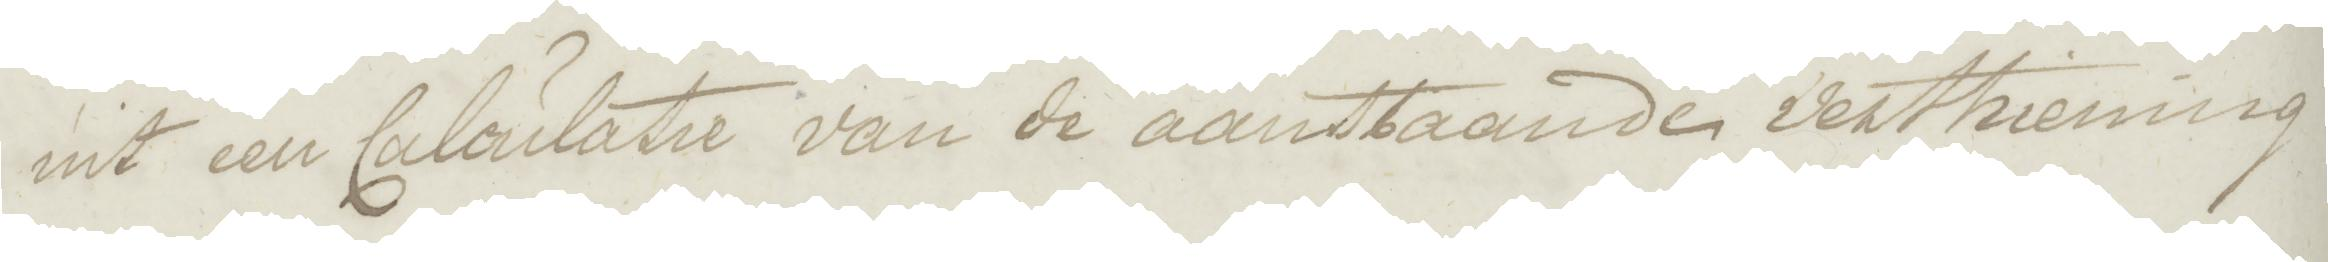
uit een Calculatie van de aanstaande verthiening
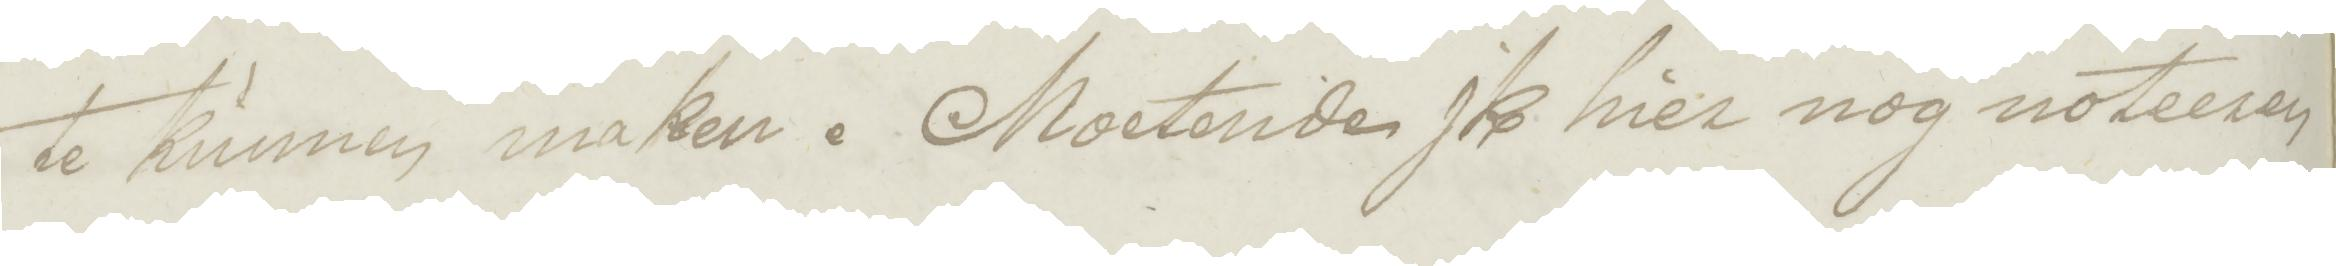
te kunnen maken. Moetende jk hier nog noteeren
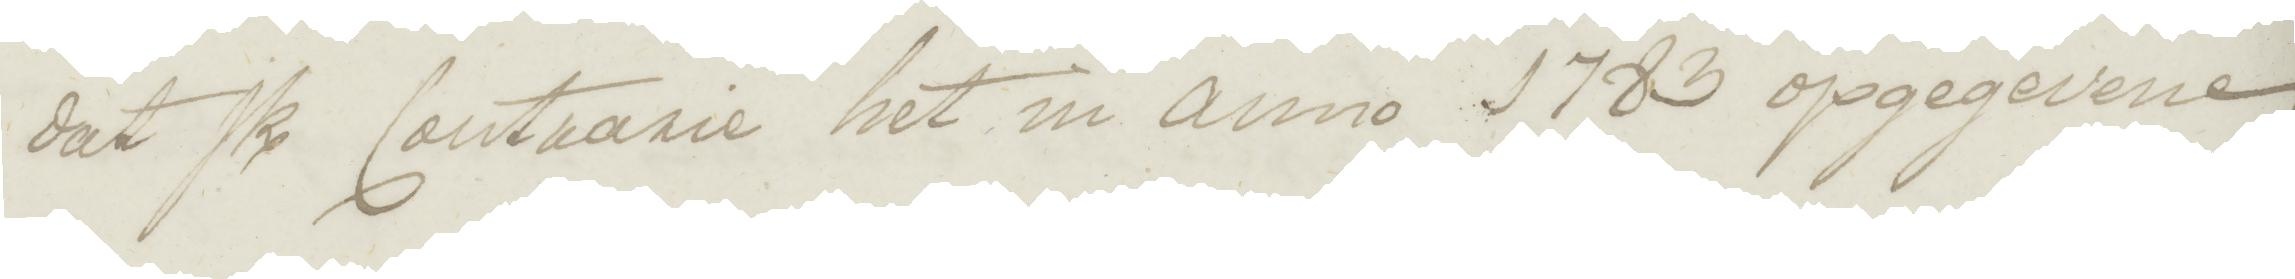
dat jk Contrarie het in anno 1783 opgegevene
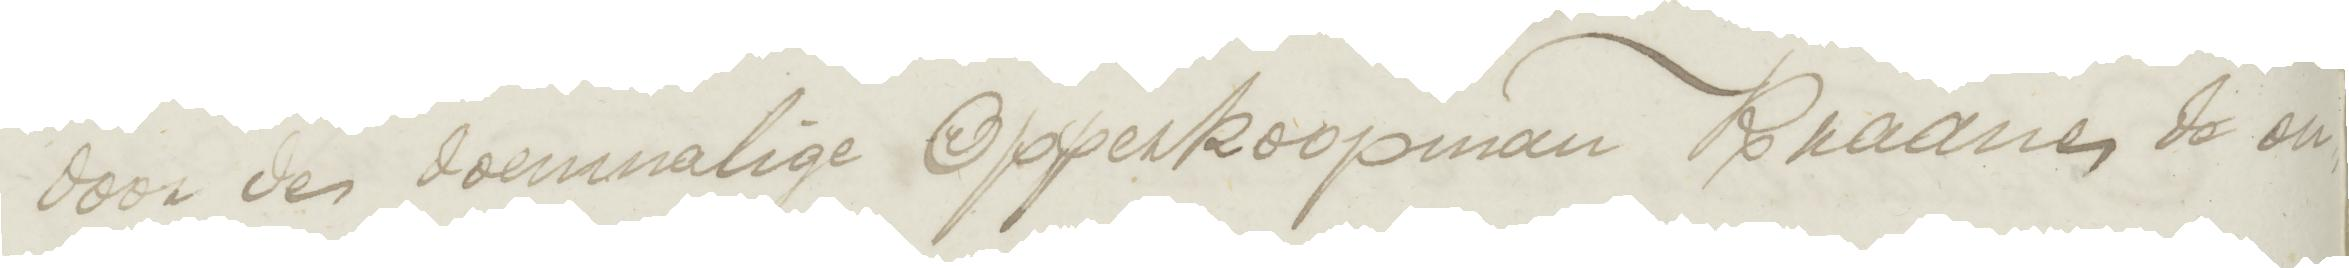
door de doenmalige Opperkoopman Kraanen de on
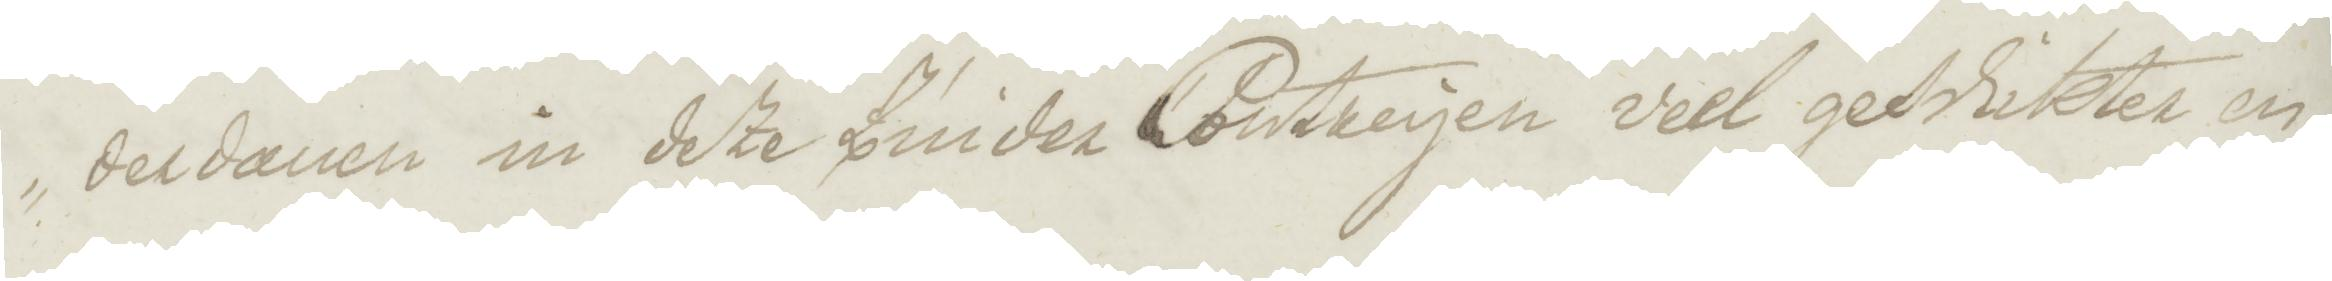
„derdanen in deze zuider Contreijen veel geschikter en
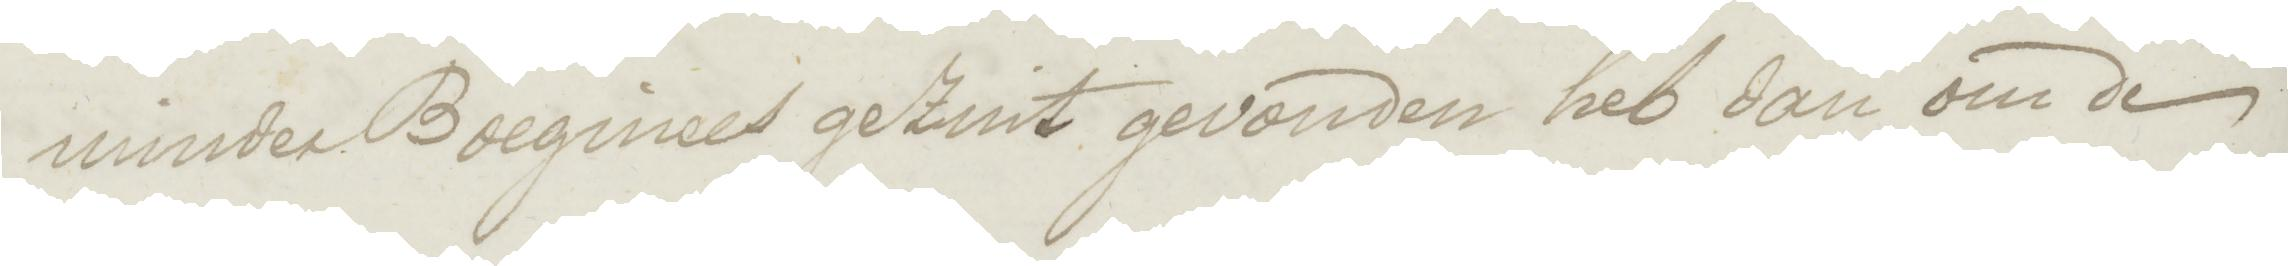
minder Boeginees gezint gevonden heb dan om de
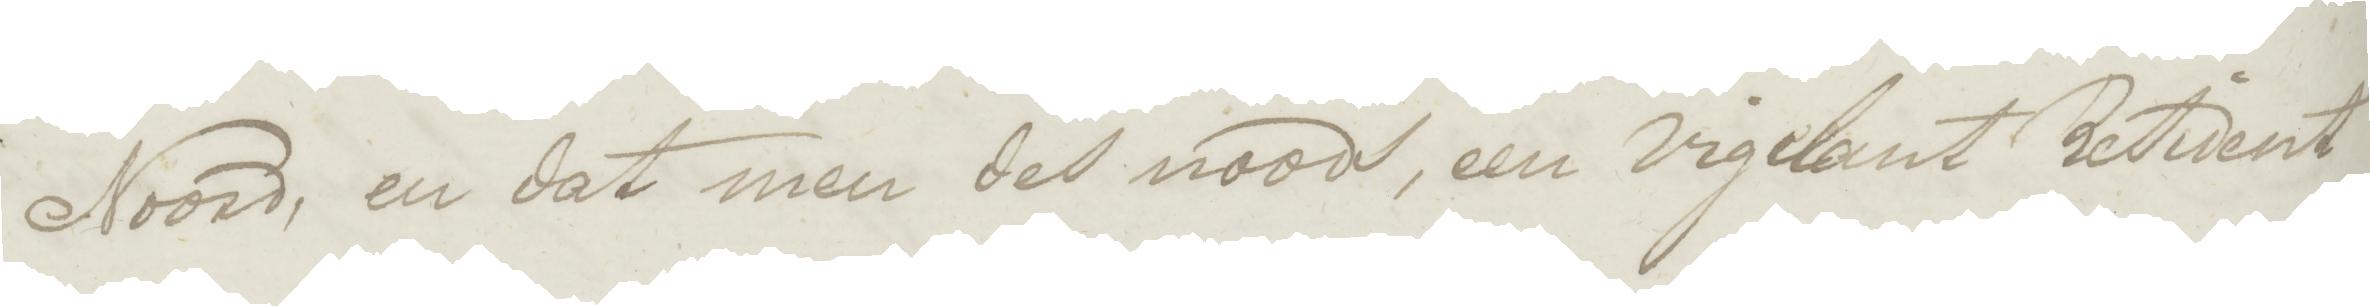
Noord, en dat men des noods, een vigelant resident
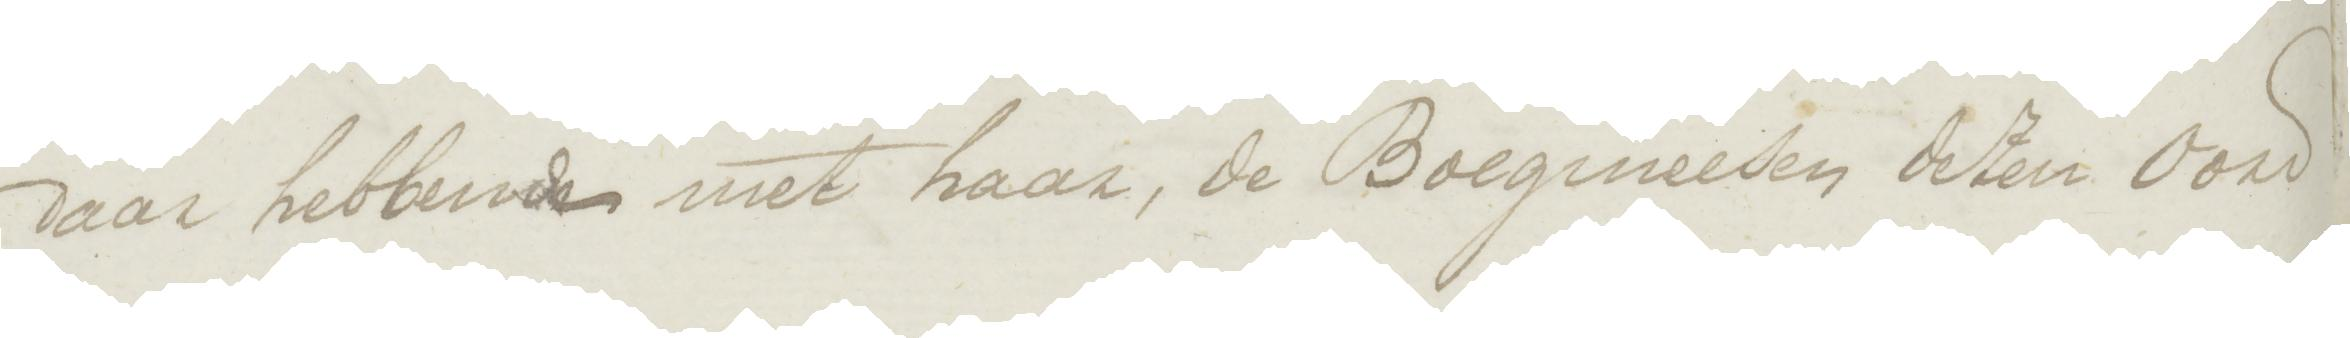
daar hebbende met haar, de Boegineesen dezen oord
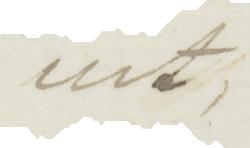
uit,
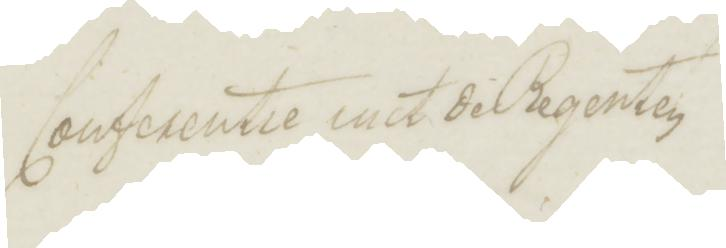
Conferentie met de Regenten
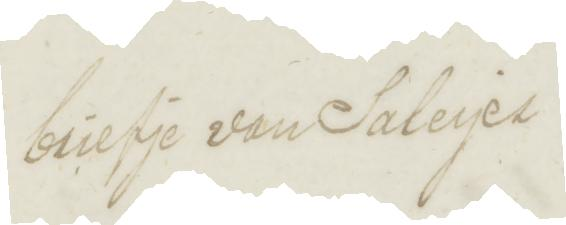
briefje van Saleijer
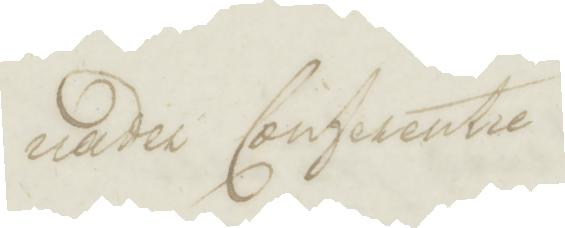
nader Conferentie
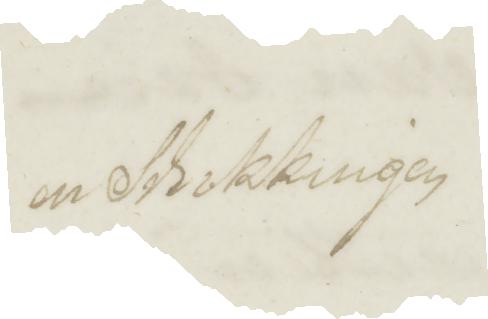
en Schikkingen
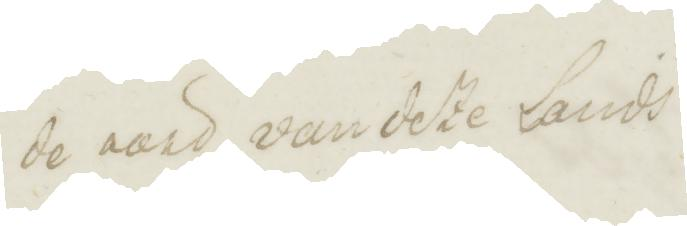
de aard van deze lands
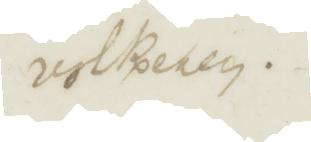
volkeren.
